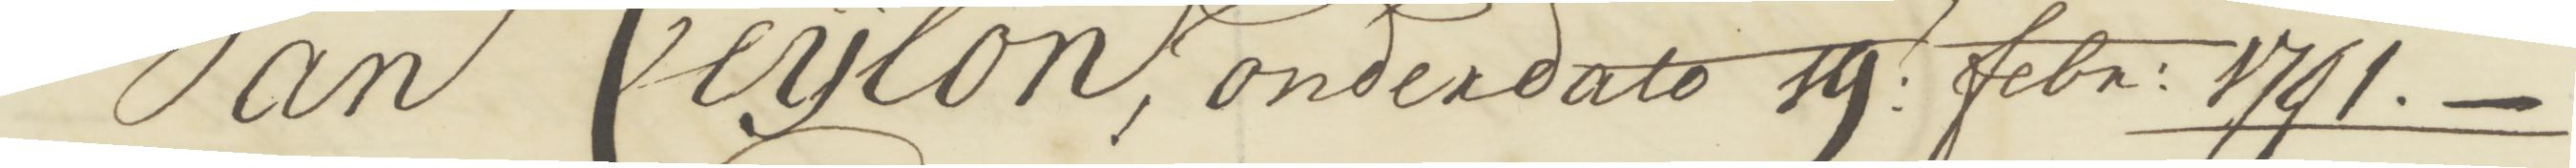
Van Ceijlon, onder dato 19:' febr: 1741
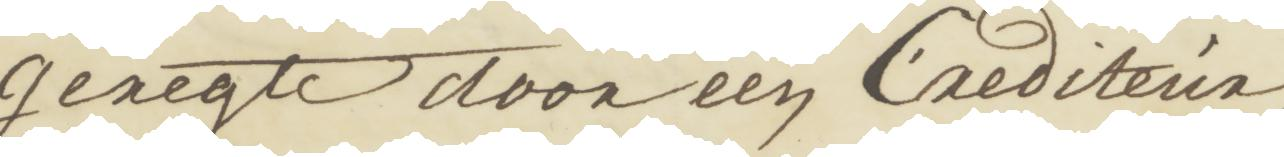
geregte door een Crediteur
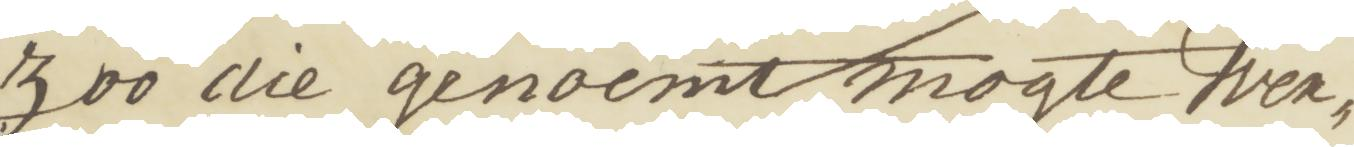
zoo die genoemt mogte wer„
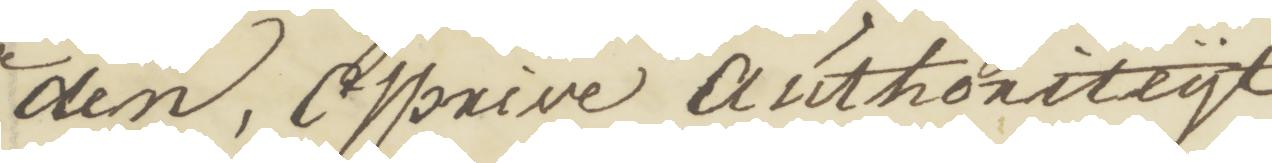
den, Opprive Authoriteijt
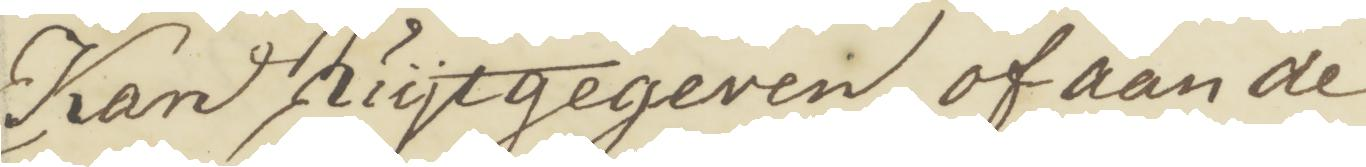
kan uijtgegeven, of aan de
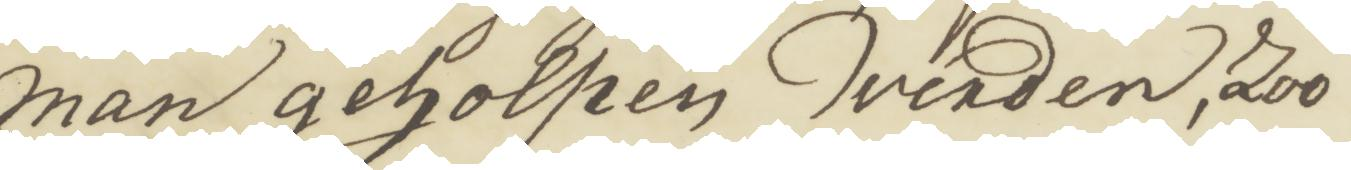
man geholpen werden, zoo
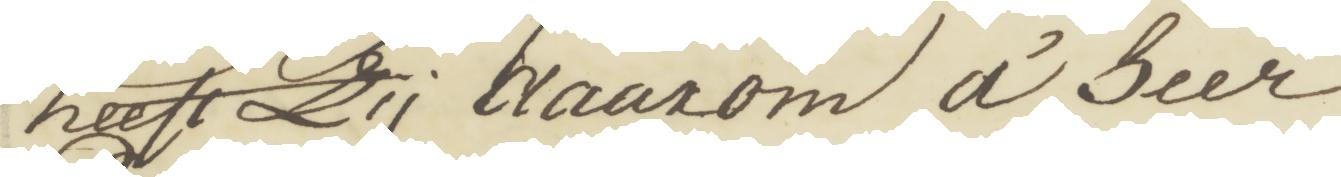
heeft zij daarom d’ heer
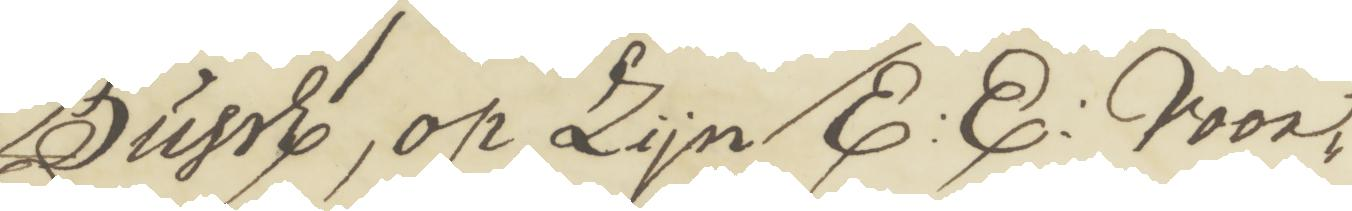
Busch, op zijn E: E: voor„
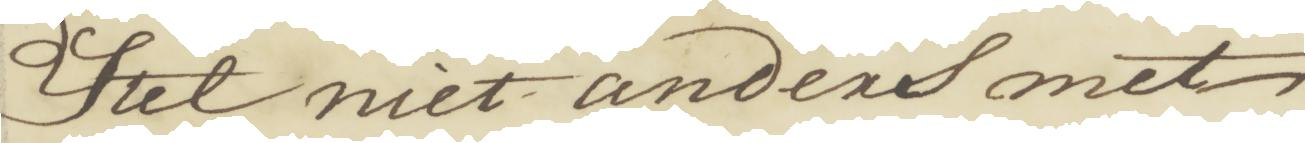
stel niet anders met
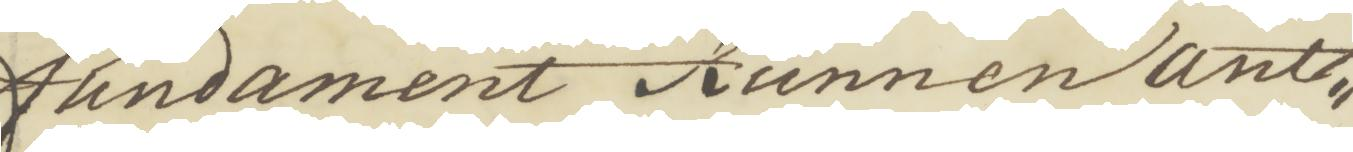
fundament kunnen ant„
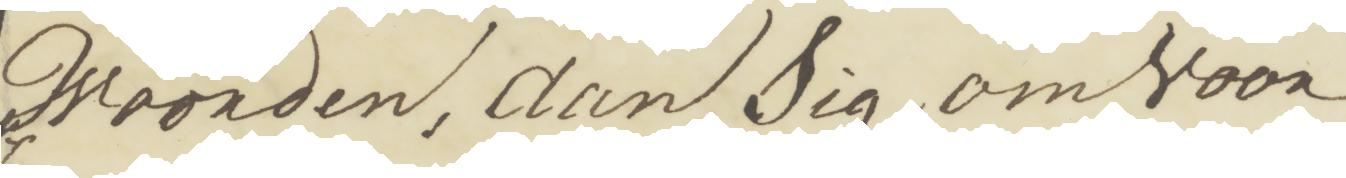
woorden, dan Sig om voor
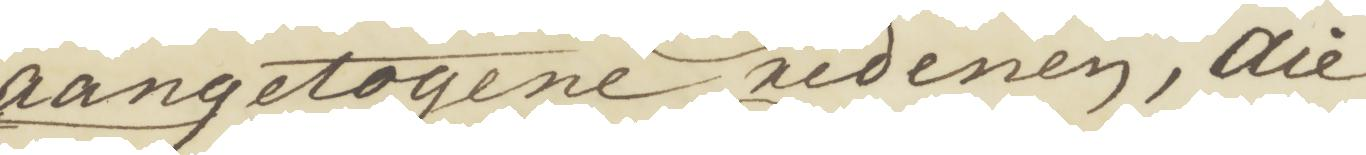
aangetogene redenen, die
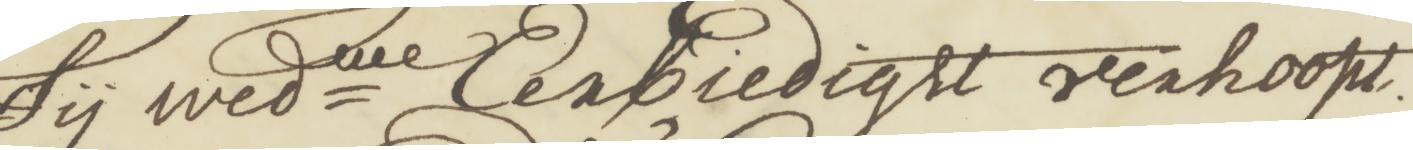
sij wed=we Eerbiedight verhoopt.
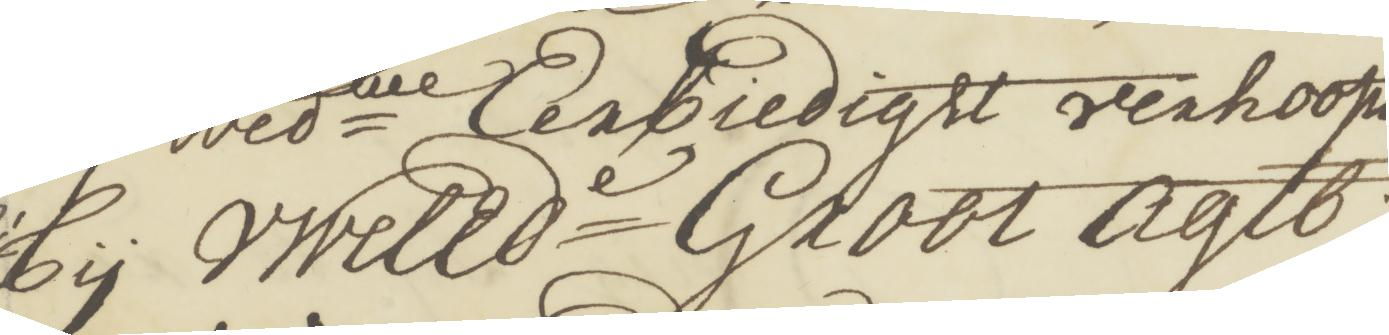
bij vweled=e Groot agbt:
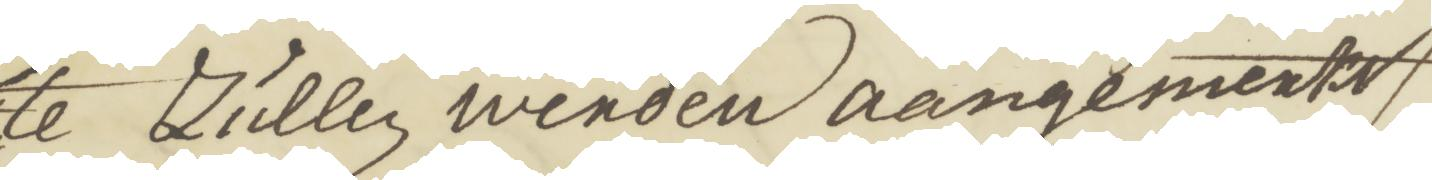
te zullen werden aangemerkt/
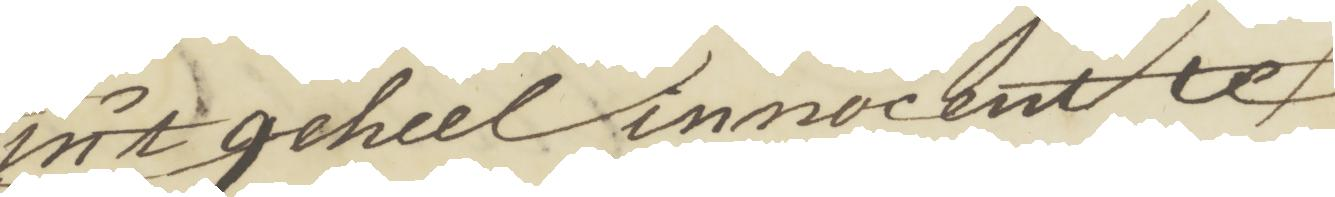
in't geheel innocent te
